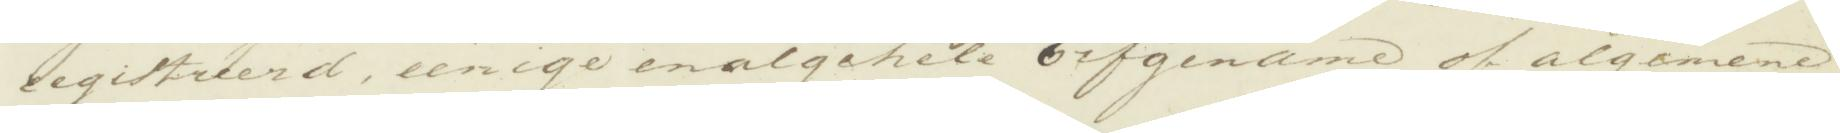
registreerd, eenige en algehele Erfgename of algemene
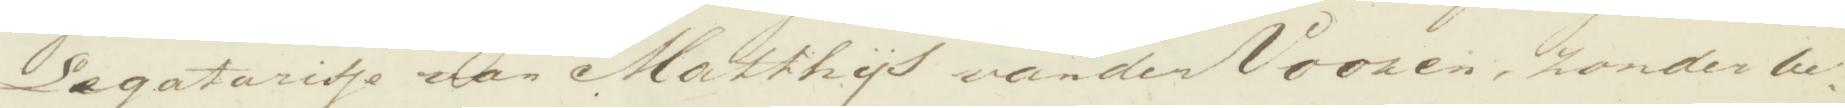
Legatarisse van Matthijs van der Vooren, zonder be
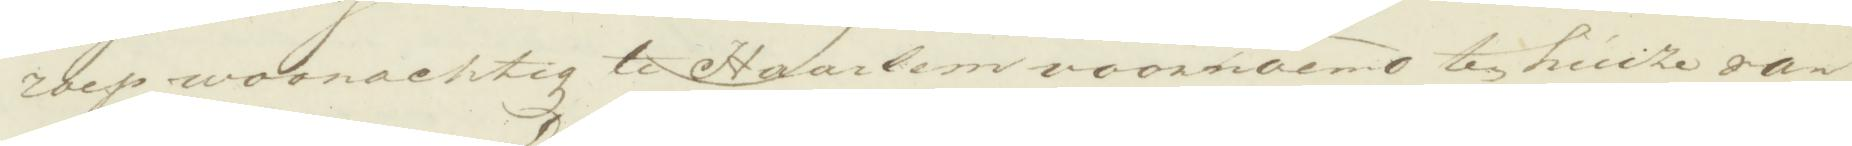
roep woonachtig te Haarlem voornoemd ten huize van
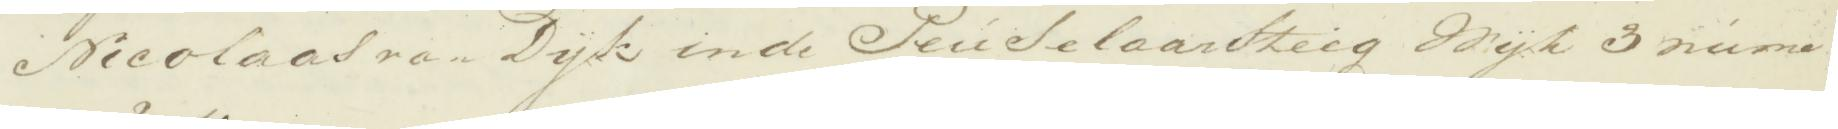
Nicolaas van Dijk in de Peuselaarsteeg Wijk 3 nume
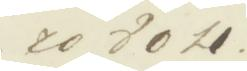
ro 804
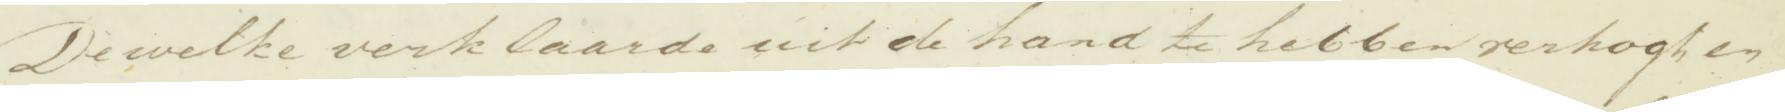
De welke verklaarde uit de hand te hebben verkogt en
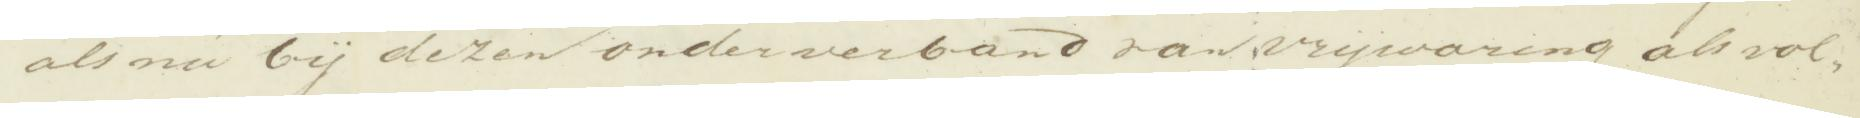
als nu bij dezen onder verband van vrijwaring als vol„
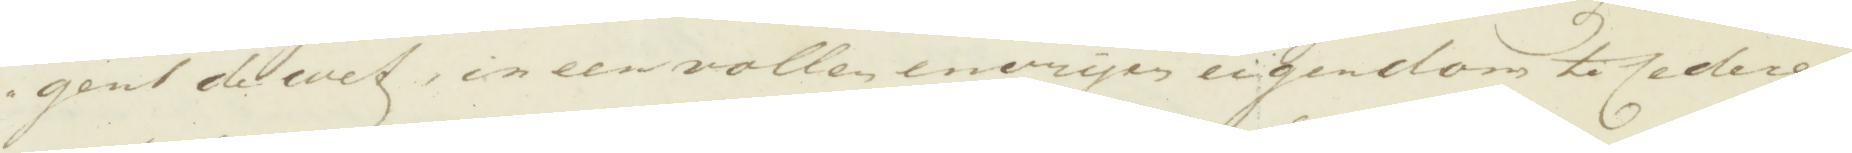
„gens de wet, in een vollen en vrijen eigendom te cederen
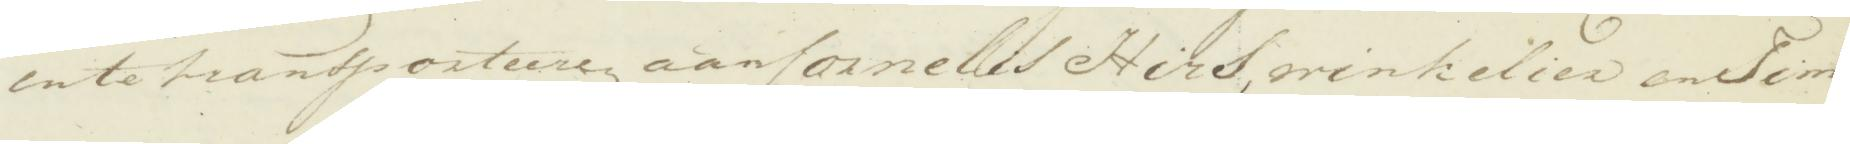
en te transporteeren aan Cornelis Hirs, winkelier en Tim
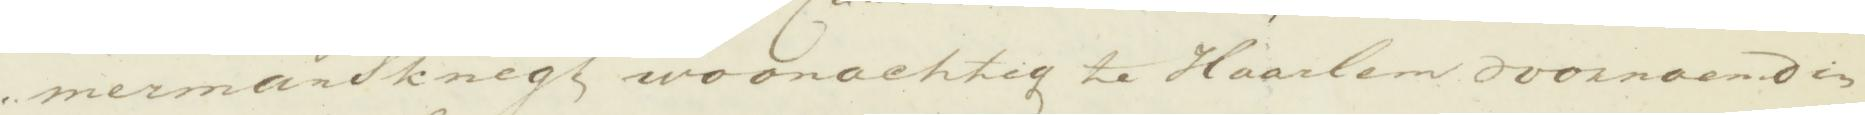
mermansknegt woonachtig te Haarlem voornoemd in
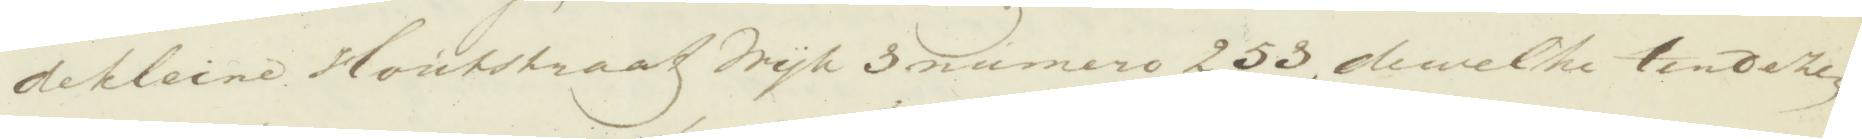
de kleine Houtstraat Wijk 5 numero 253, dewelke ten dezen
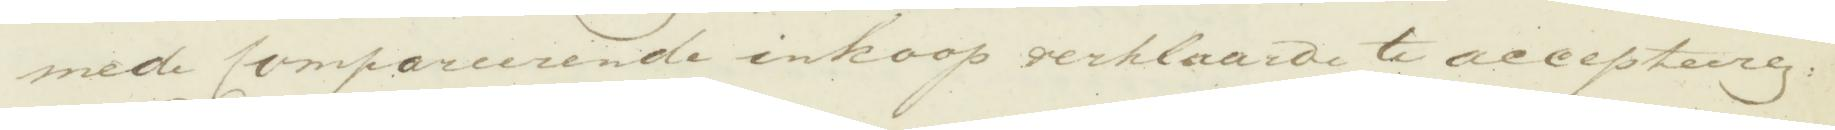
mede Compareerende inkoop verklaarde te accepteeren.
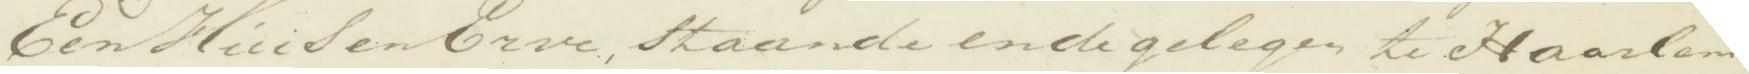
Een Huis en Erve, staande ende gelegen te Haarlem
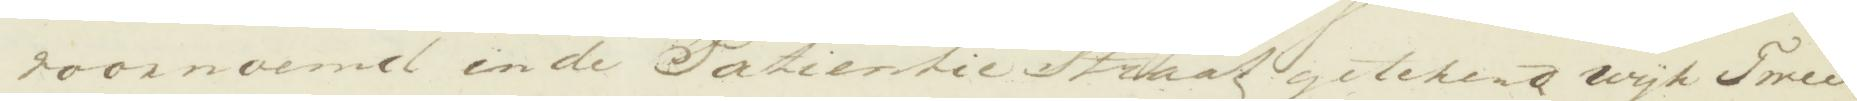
voornoemd in de Patientie straat getekend wijk Twee
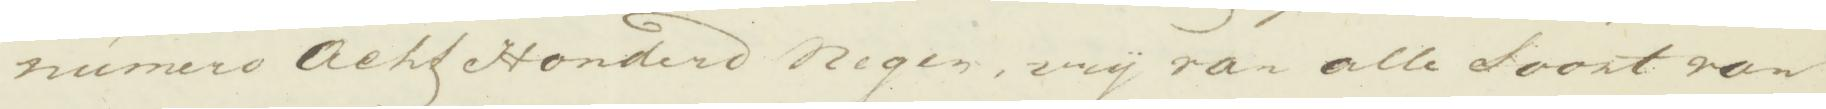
numero Acht Honderd Negen, vrij van alle soort van
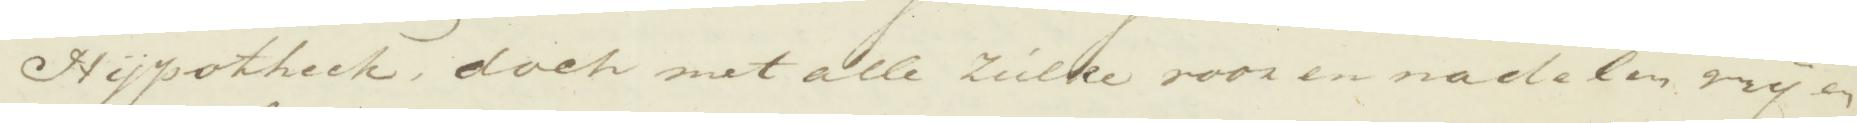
Hijpotheek, doch met alle zulke voor en nadelen vrij en
